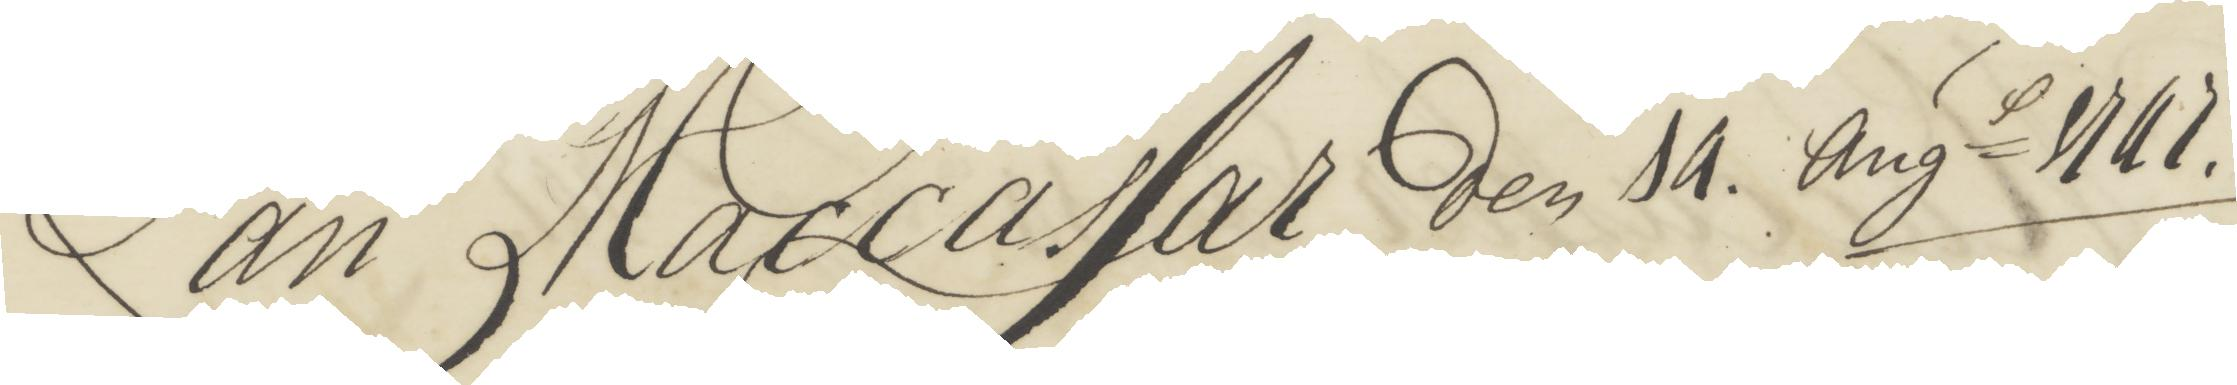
Van Maccassar den 14. Aug=s 1747.
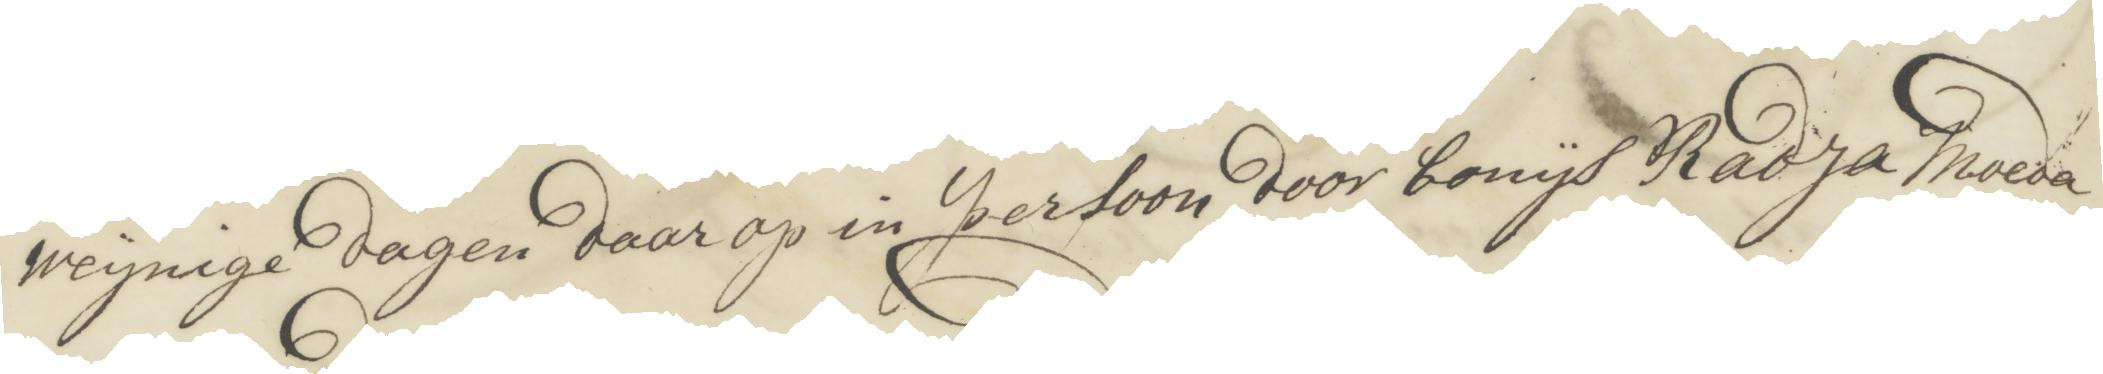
weijnige dagen daar op in persoon door bonijs Radja Moeda
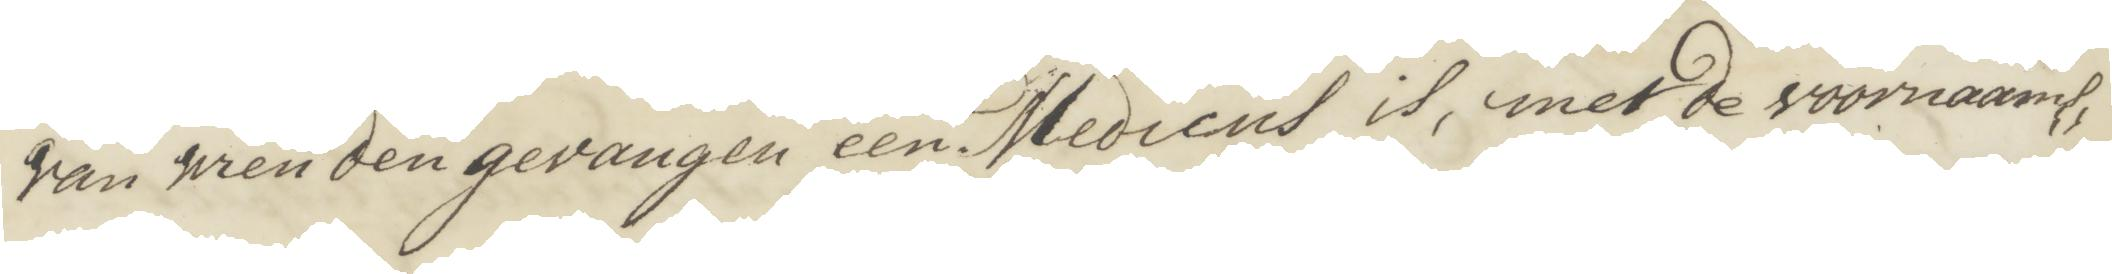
van wien den gevangen een Medicus is, met de voornaams„
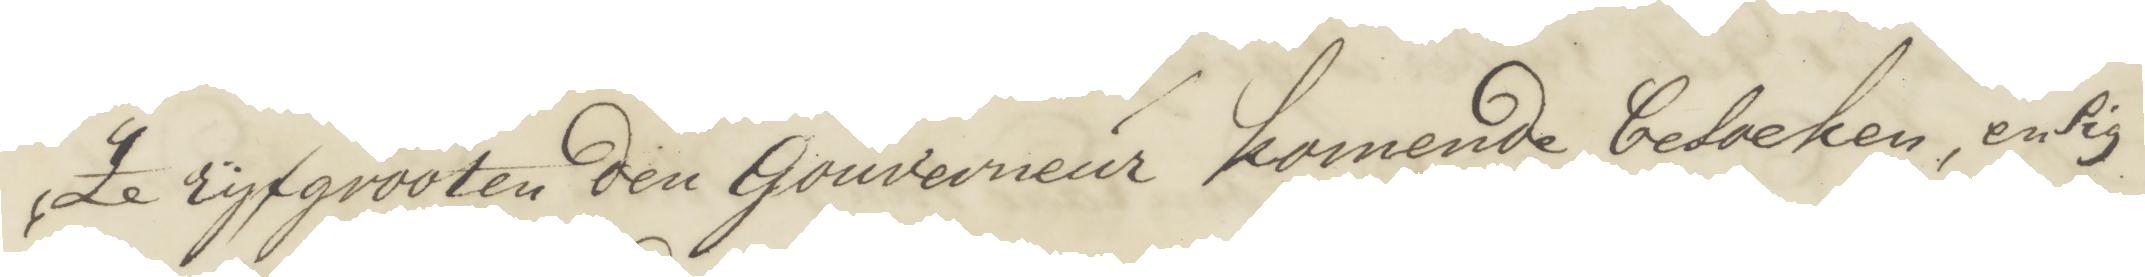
„te rijxgrooten den Gouverneur komende besoeken, en sig
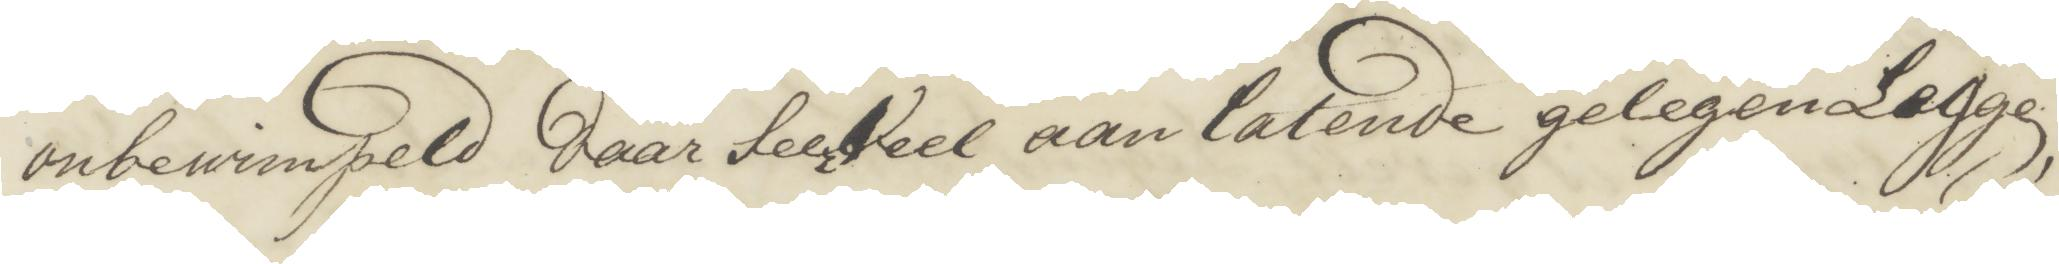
onbewimpeld daar seerveel aan latende gelegen Leggen,
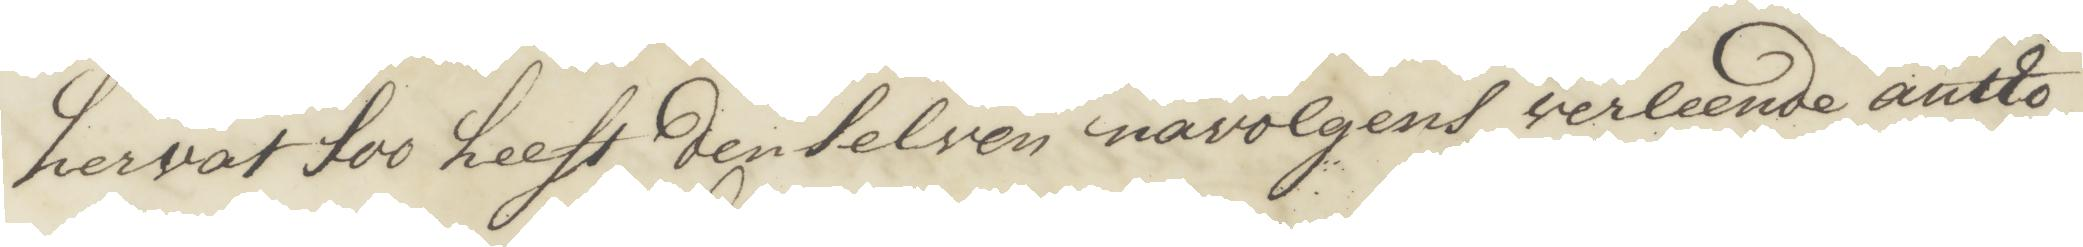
hervat soo heeft denselven navolgens verleende autho
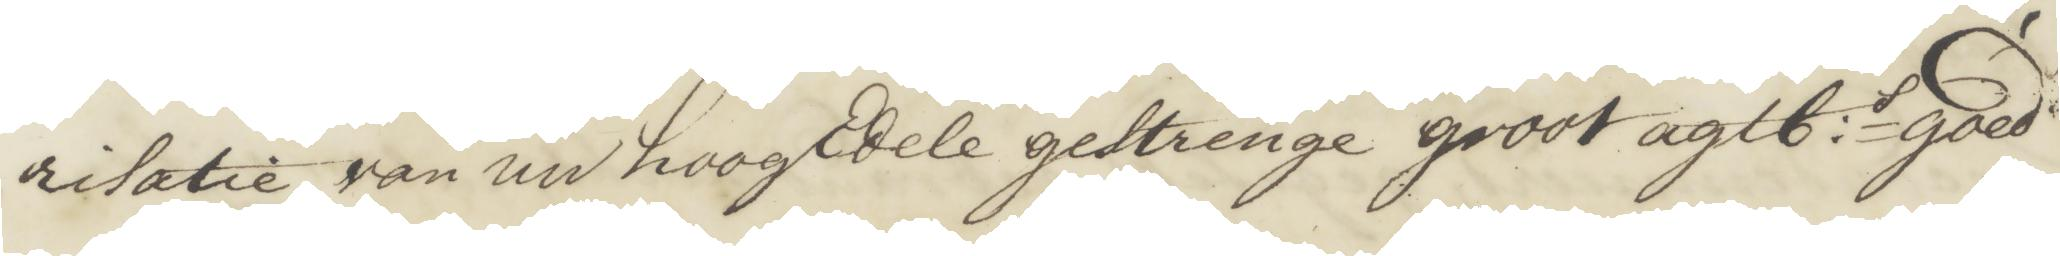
risatie, van uw hoog Edele gestrenge groot agtb:=s goed
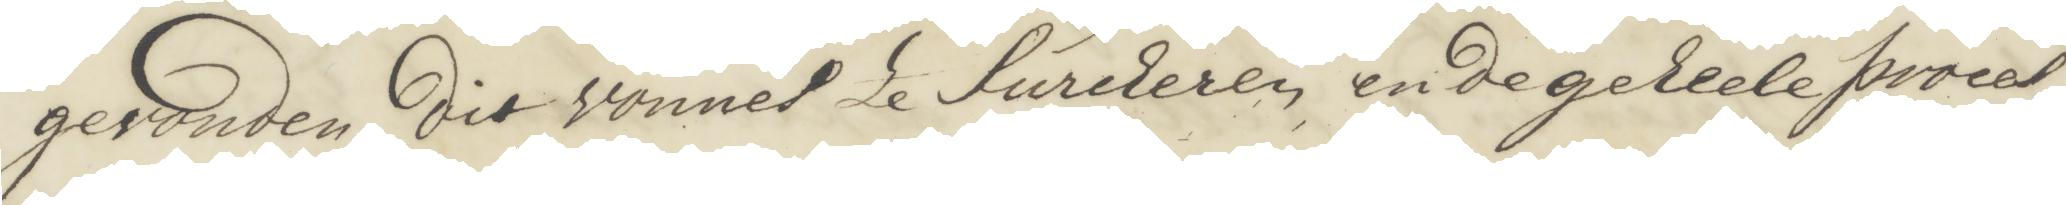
gevonden, dit vonnes te surcheren, en de geheele proces
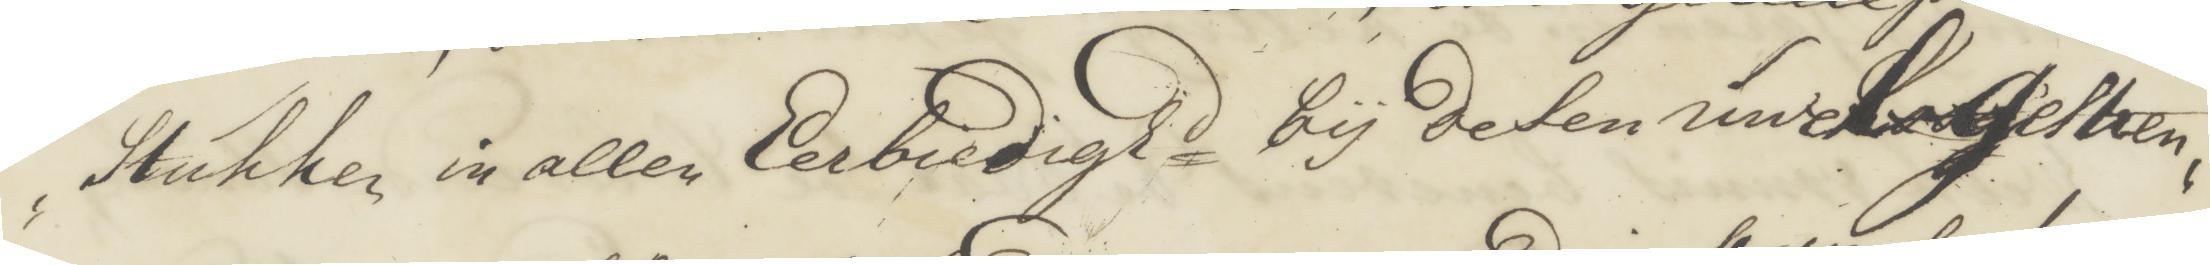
„ stukken in allen Eerbiedigh=d bij desen uwel Gestren„
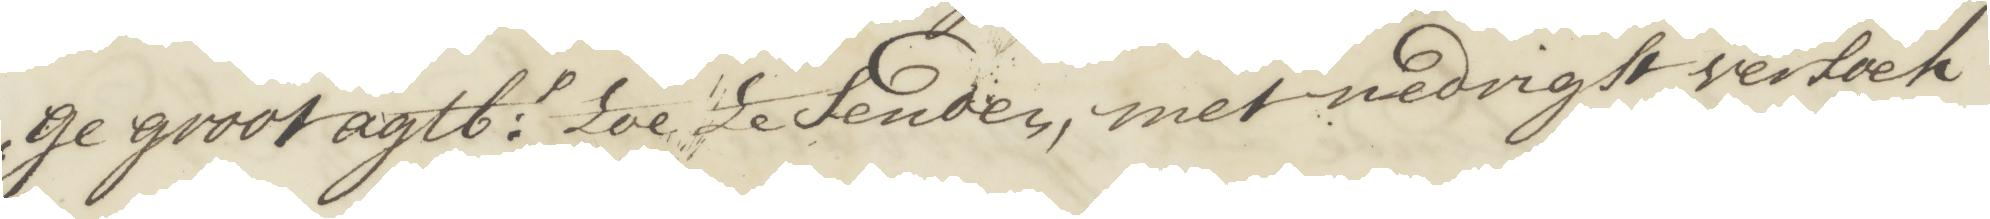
„ge groot agtb:s toe te senden, met nedrigst versoek
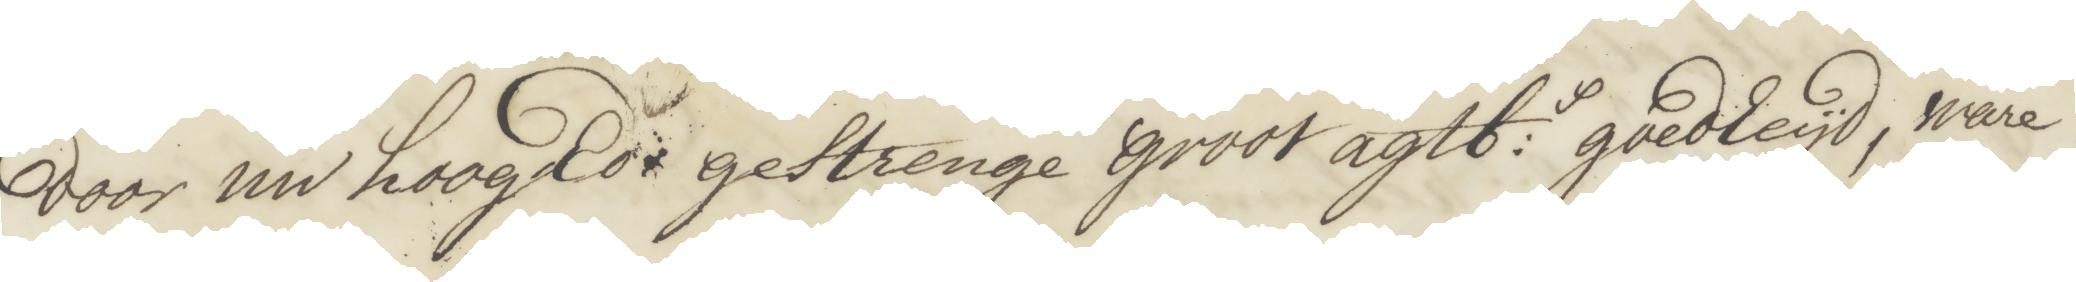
door uw hoog Ed: gestrenge groot agtb:s goedheijd, ware
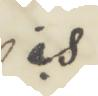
is,
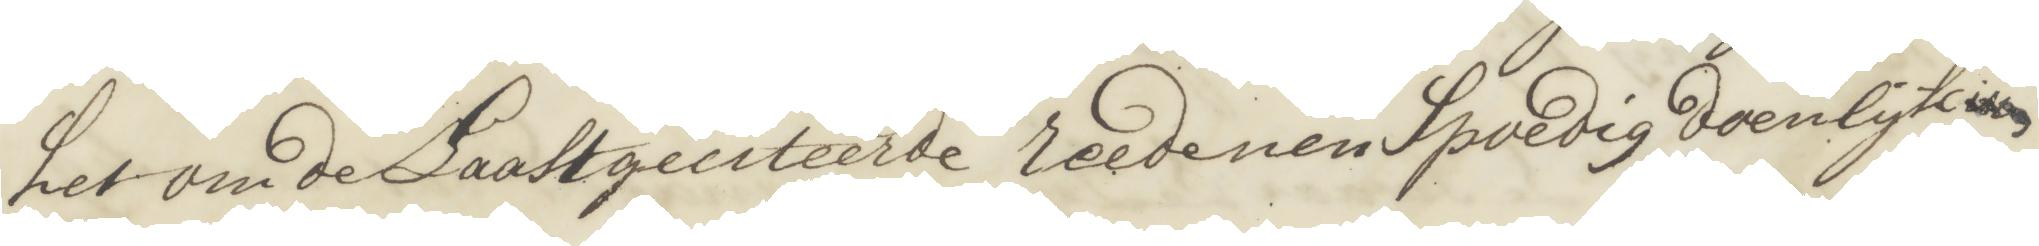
het om de Laastgeciteerde reedenen spoedig doenlijk
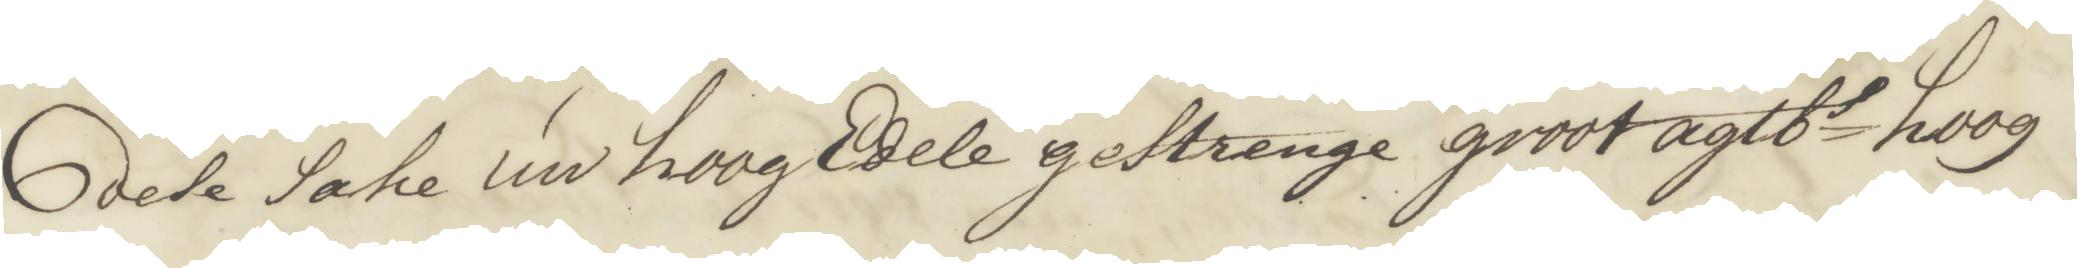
dese sake uw hoog Edele gestrenge groot agtb=s hoog
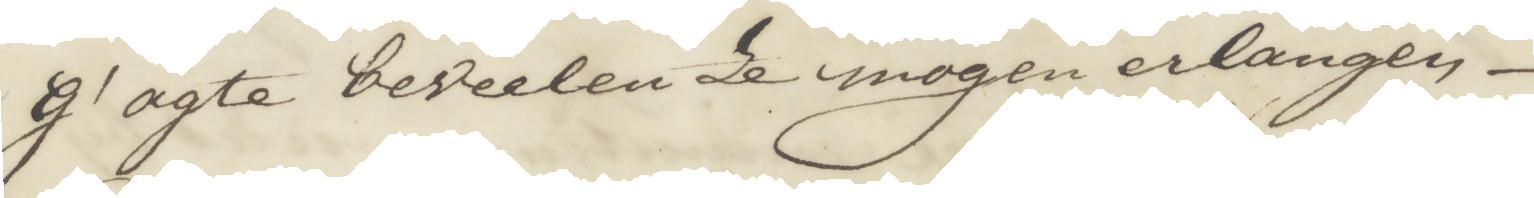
g’agte beveelen te mogen erlangen —
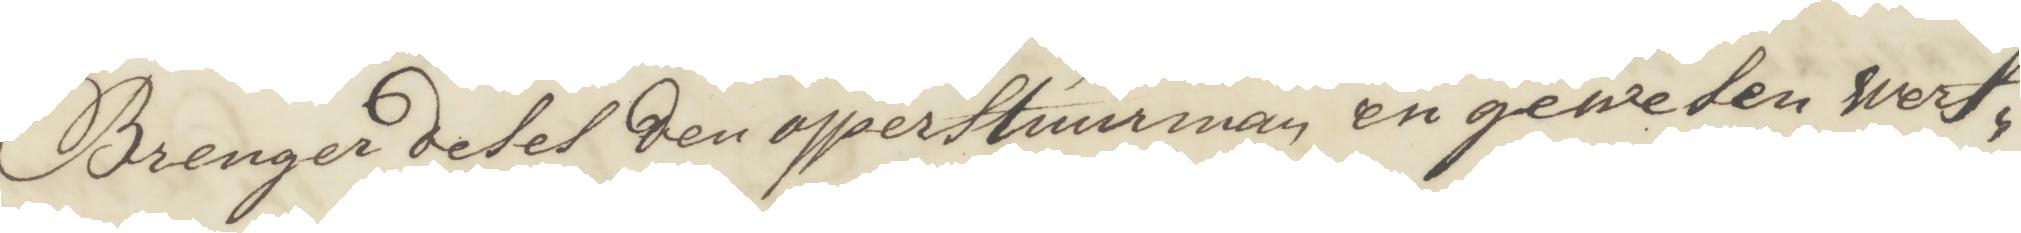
Brenger deses den opperstuurman en gewesen werf„
